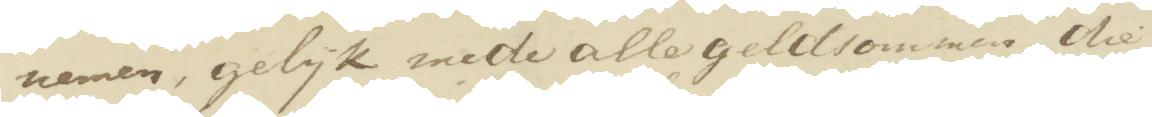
nemen, gelijk mede alle geldsommen die
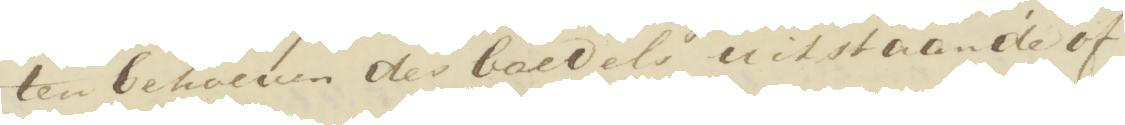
ten behoeven des boedels uitstaande of
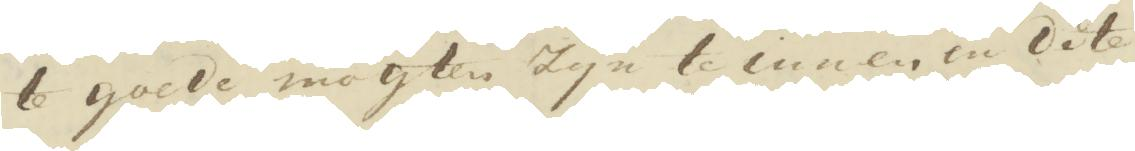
te goede mogten Zijn te innen en dito
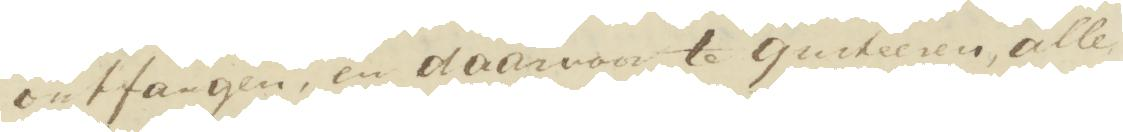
ontfangen, en daarvoor te quiteeren, alle
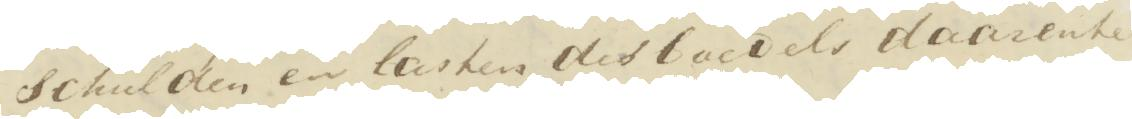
schulden en lasten des boedels daarente
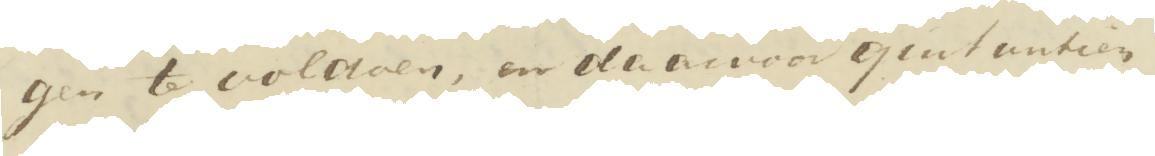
gen te voldoen, en daarvoor quitantien
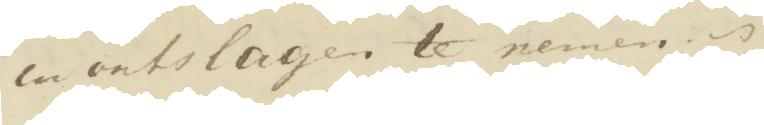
en ontslagen te nemen. ~
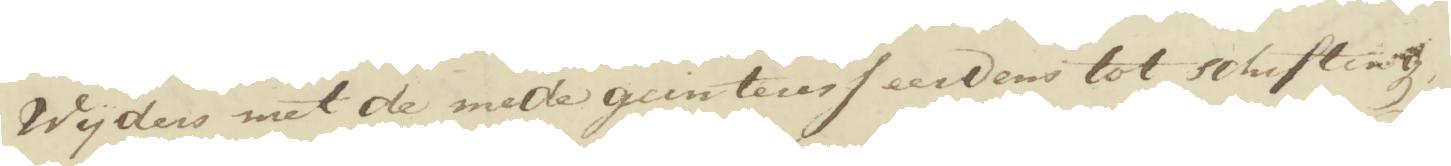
Wijders met de mede geinteresseerdens tot schiften &
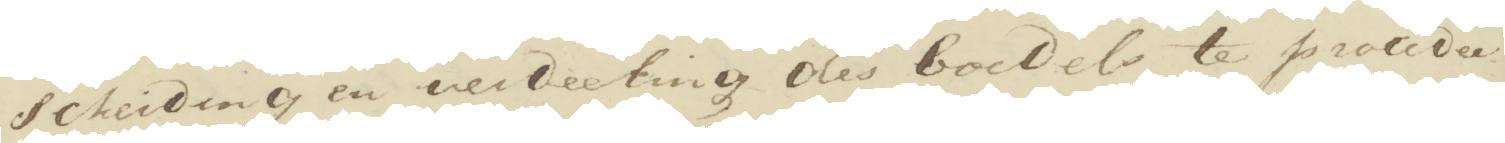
scheiding en verdeeling des boedels te procedee
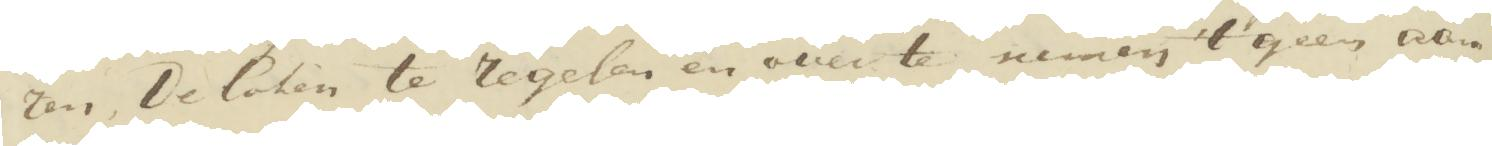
ren, De Loten te regelen en over te nemen ’t geen aan
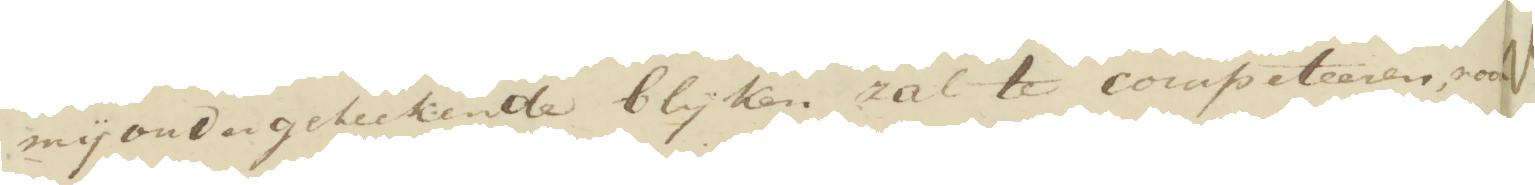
mij ondergeteekende blijken zal te competeeren, voor
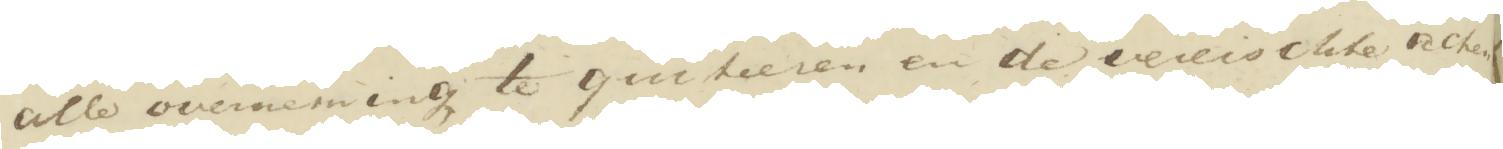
alle overneming te quiteeren en de vereischte rechten
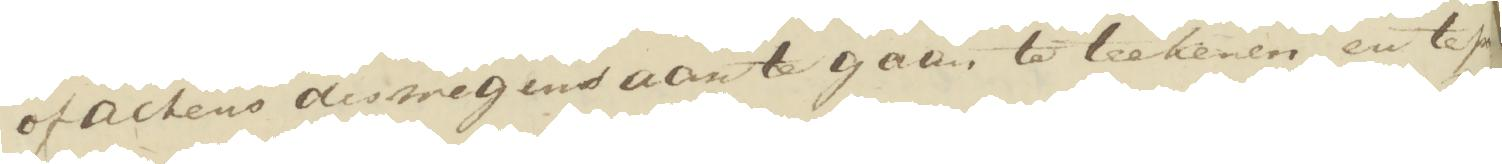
of actens deswegens aan te gaan te teekenen en te p
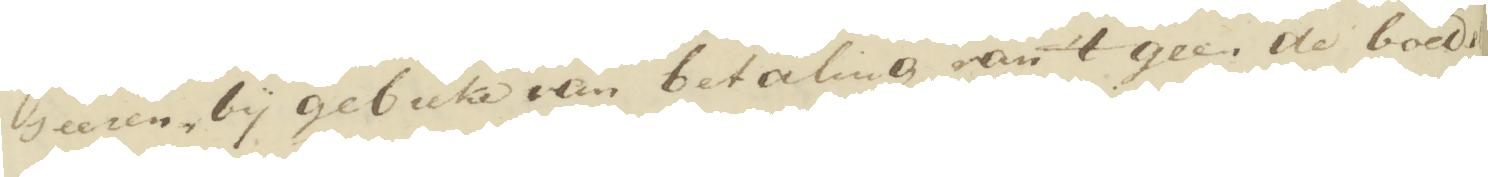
seeren, bij gebreke van betaling van ’t geen de boede
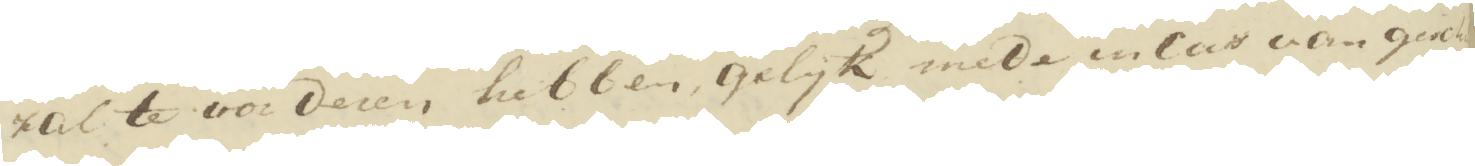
zal te vor deren hebben, gelijk mede in cas van gesch
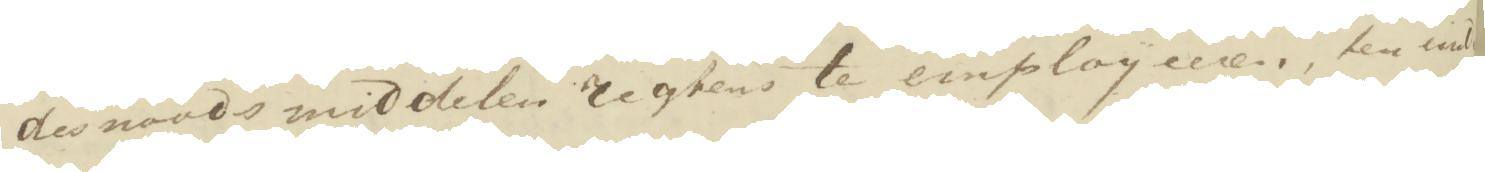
des noods middelen regtens te emploijeeren, ten uit
